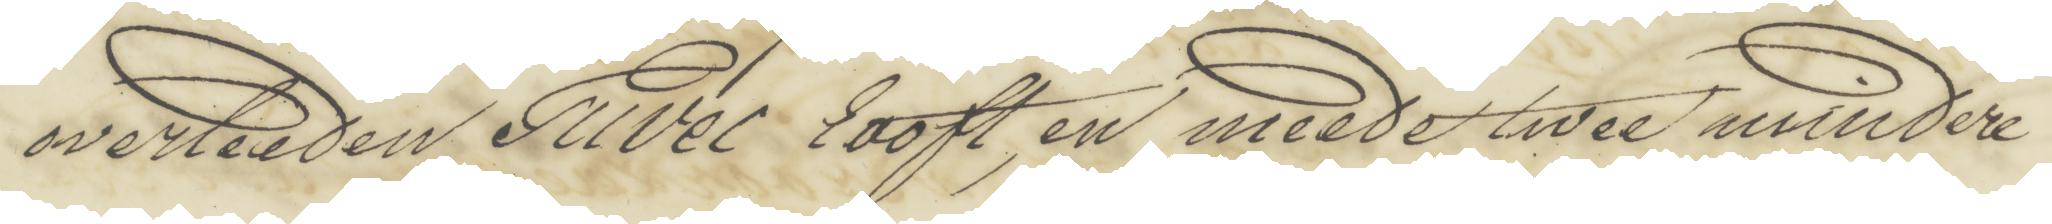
overleeden Twee hooft, en meede twee mindere
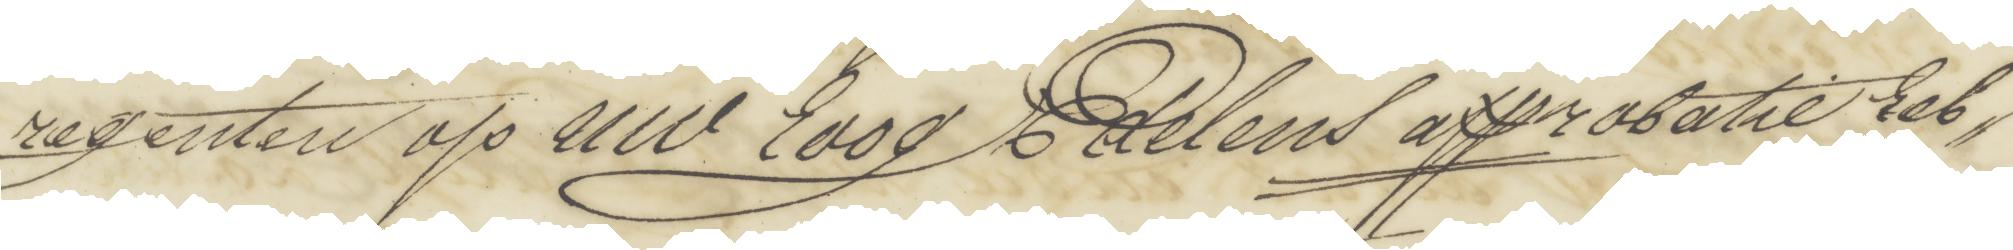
regenten op UW hoog Edelens approbatie heb„
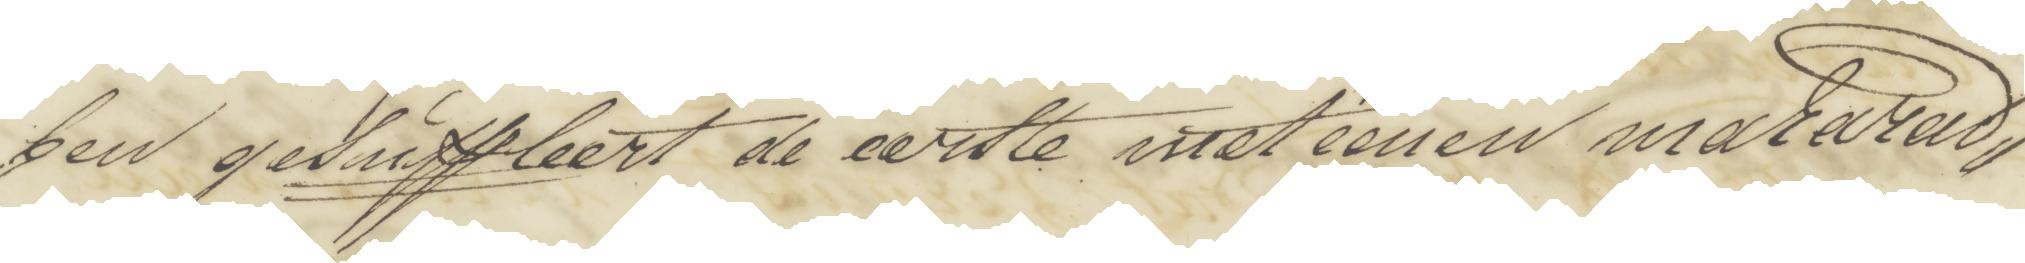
ben gesuffleert de eerste met eenen maharad
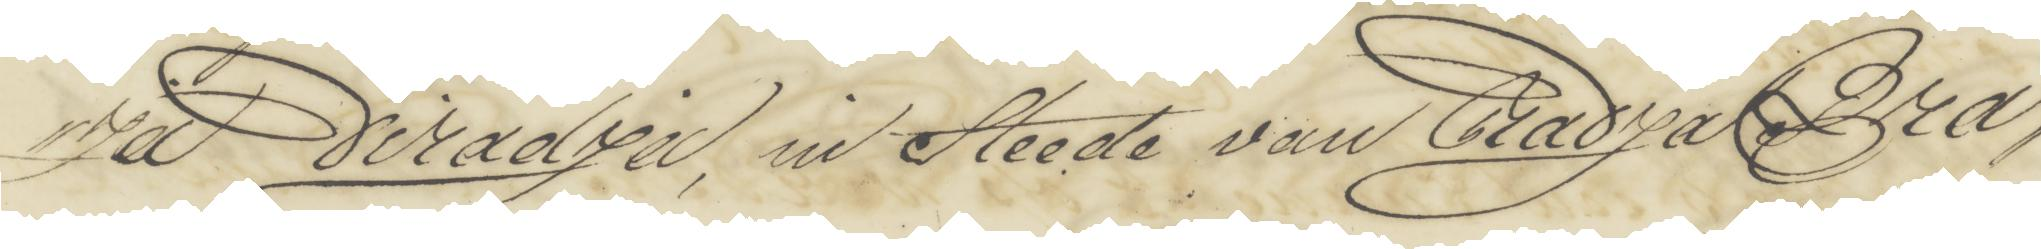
ja diradja, in steede van Radja Bra
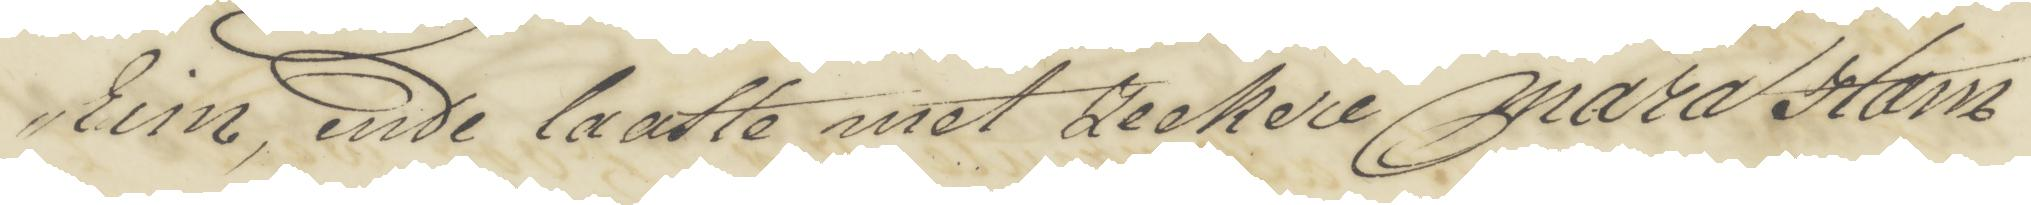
„him, ende laaste met zeekere mara Itam
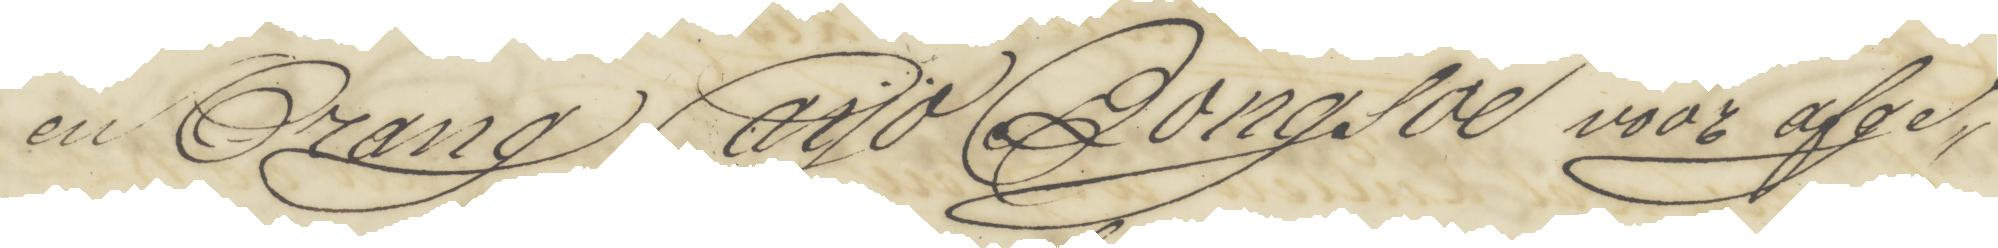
en Orang Caijo Dongsoe voor afge„
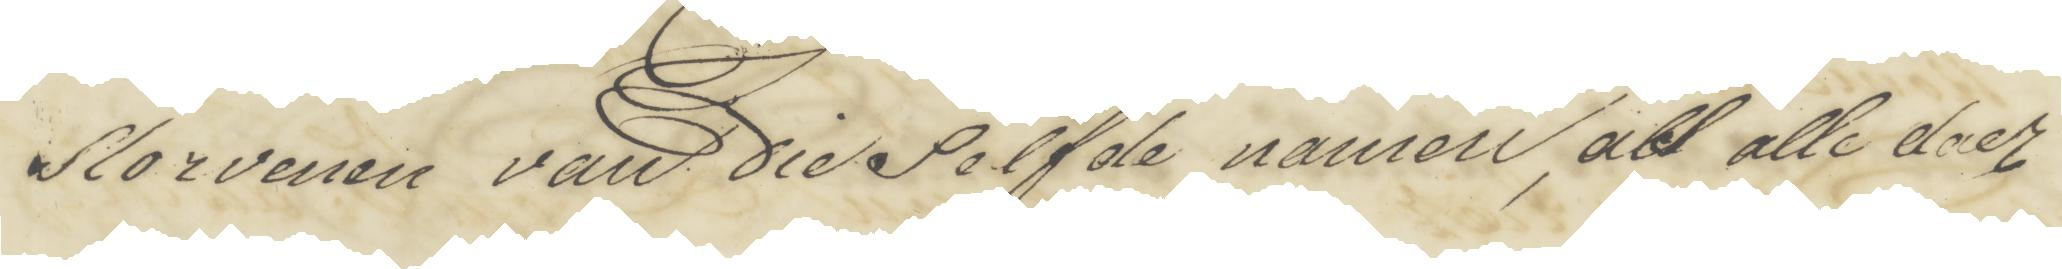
storvenen van die selfde namen all alle daer
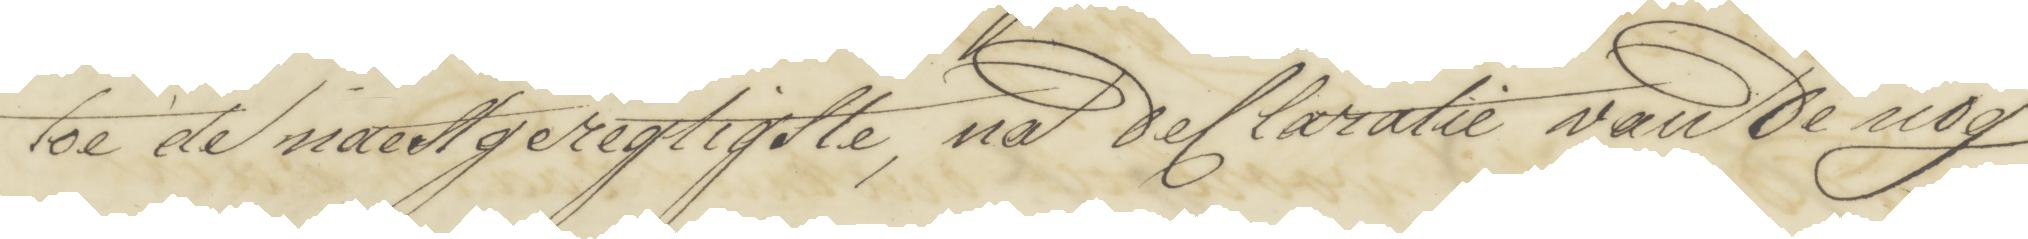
toe de naest geregtigste, na declaratie van de nog
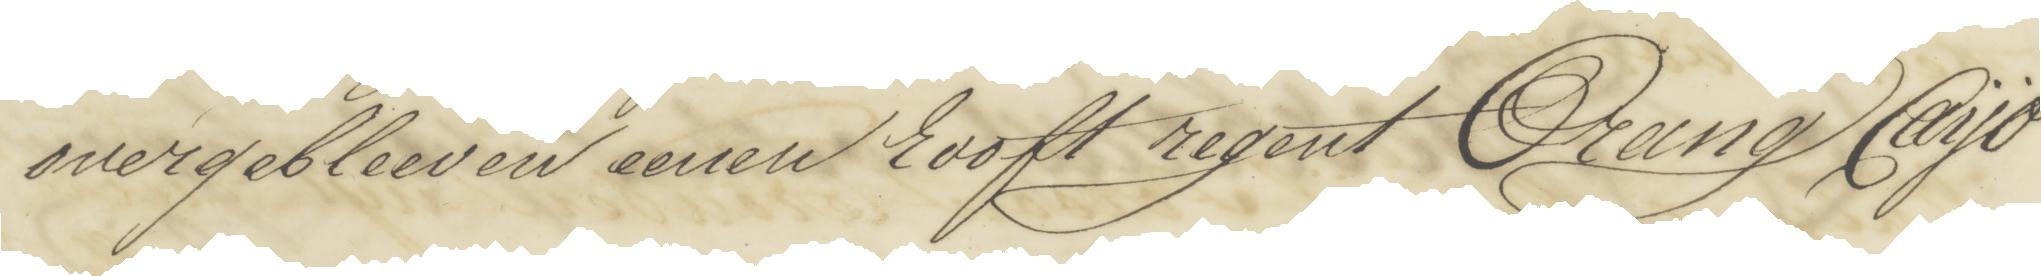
overgebleeven eenen hooft regent Orang Caijo
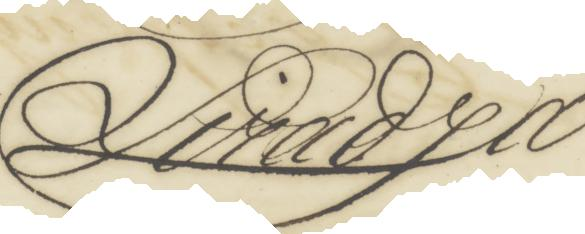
Siradja
